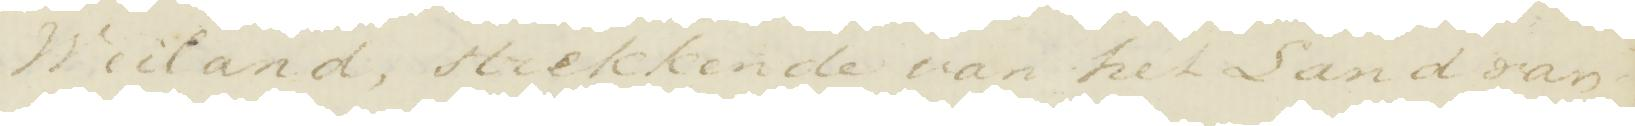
Weiland, strekkende van het Land van
